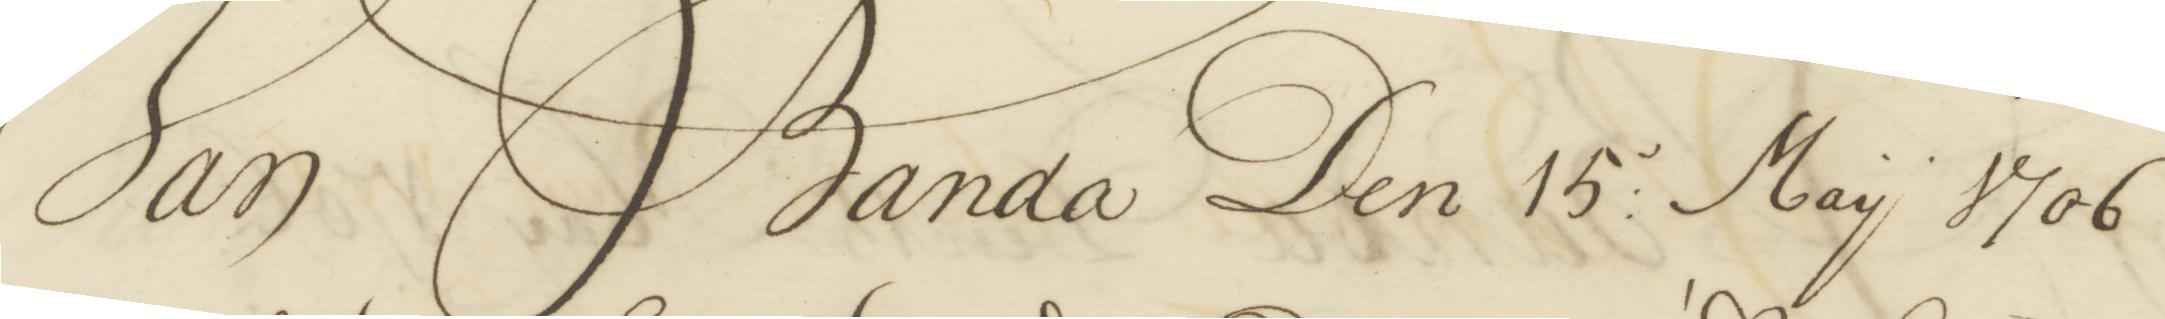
Van Banda Den 15:' Maij 1706
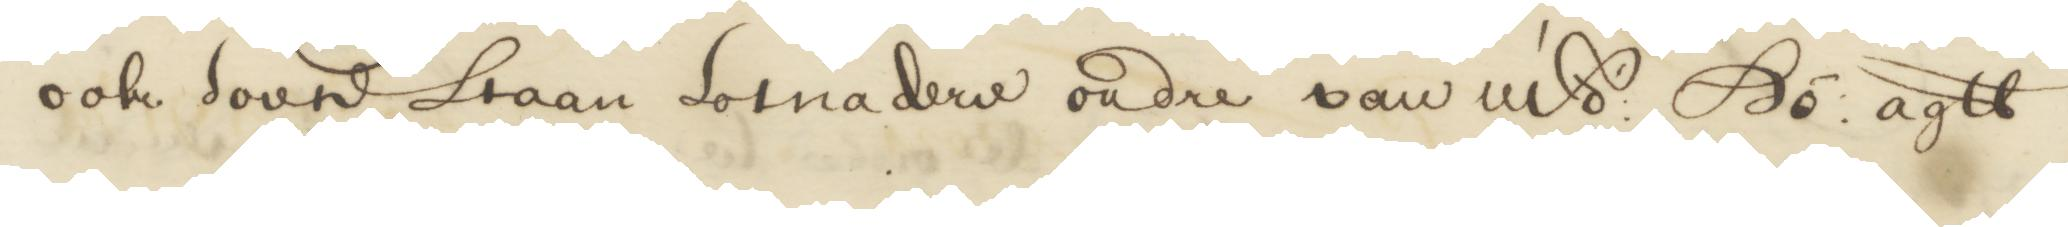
ook toetestaan tot nadere ordre van uEd: Ho: agtb
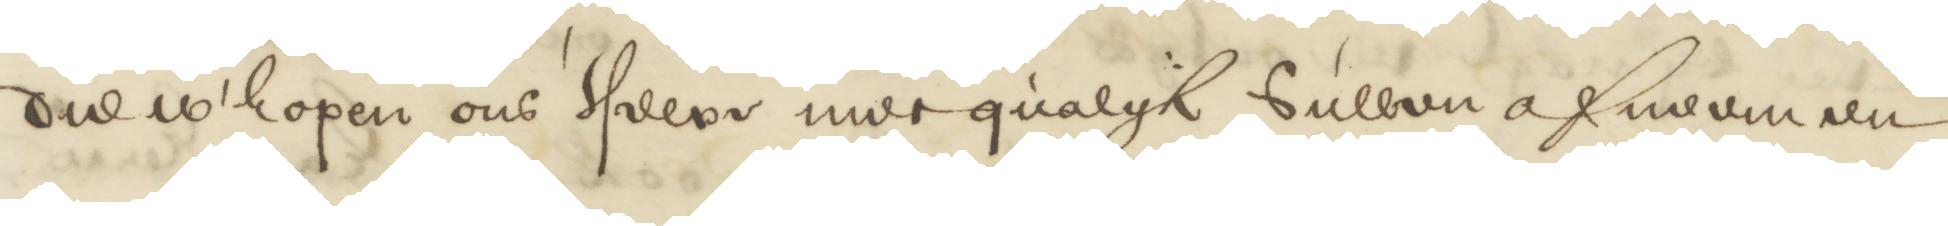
die w' hopen ons 'tselve niet qualijk sullen afneemen
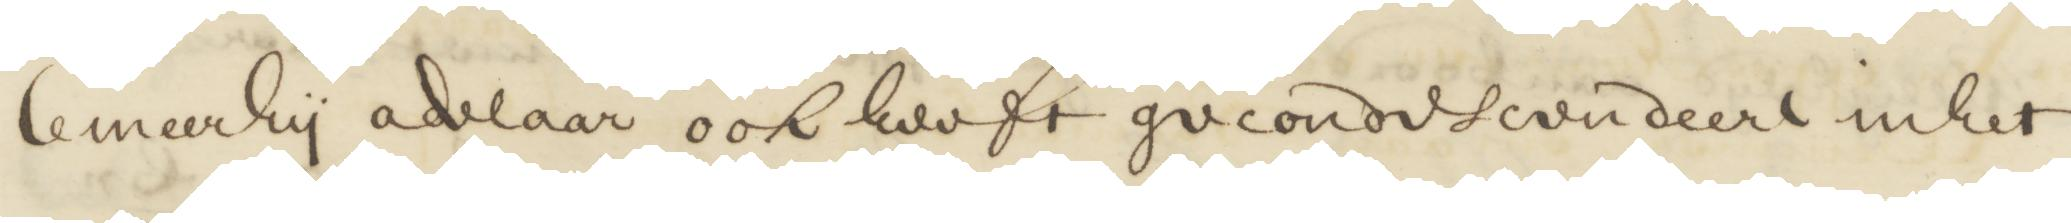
te meer hij adelaar ook heeft gecondescendeert in het
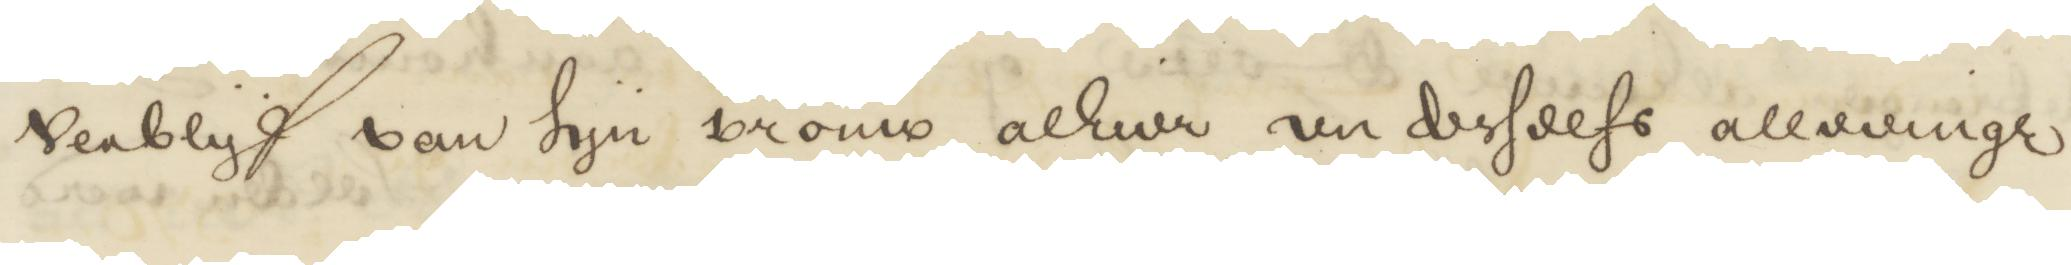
verblijf van sijn vrouw alhier en desselfs alleenigh
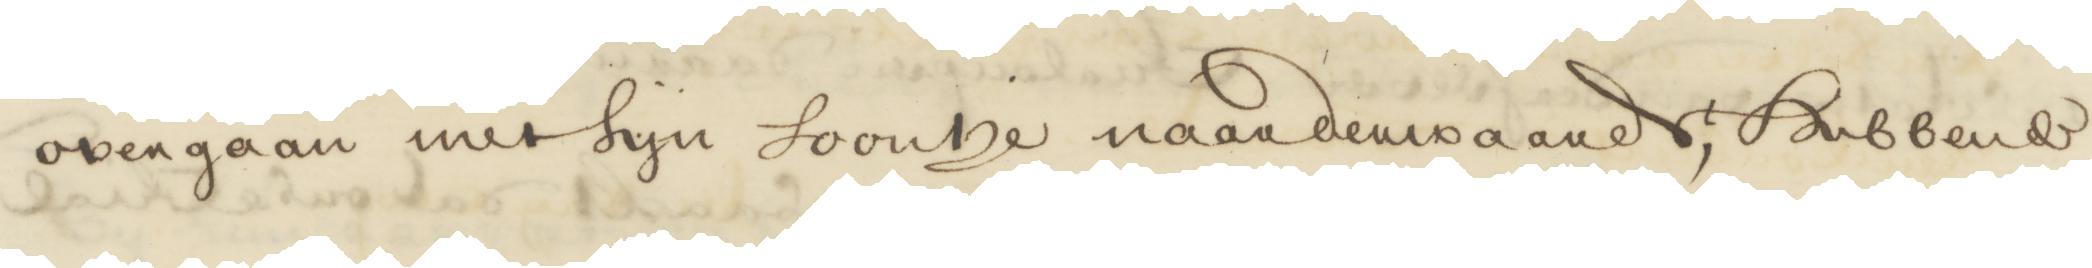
overgaan met sijn soontje naar derwaards; Hebbende
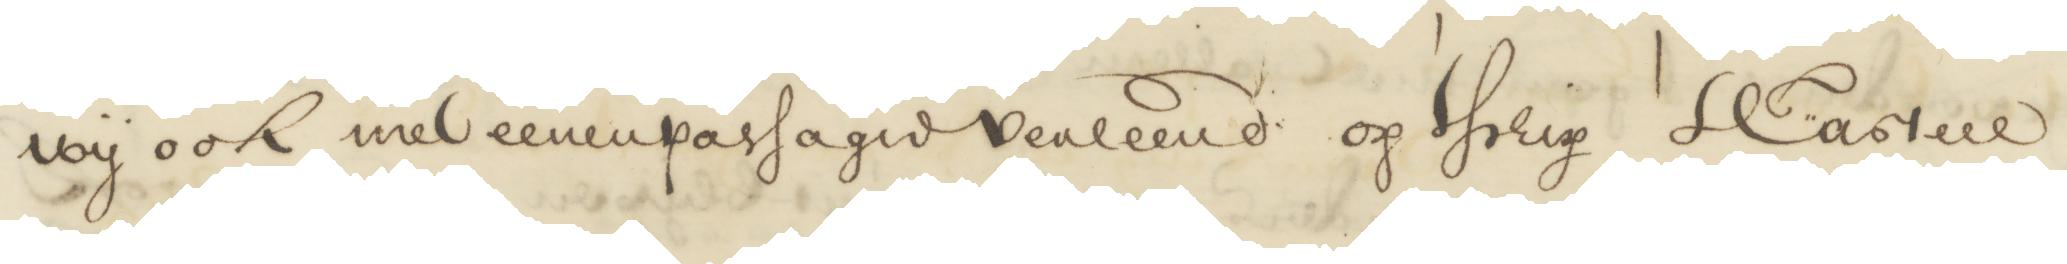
wij ook met eenen passagie verleend: op 't schip 't Casteel
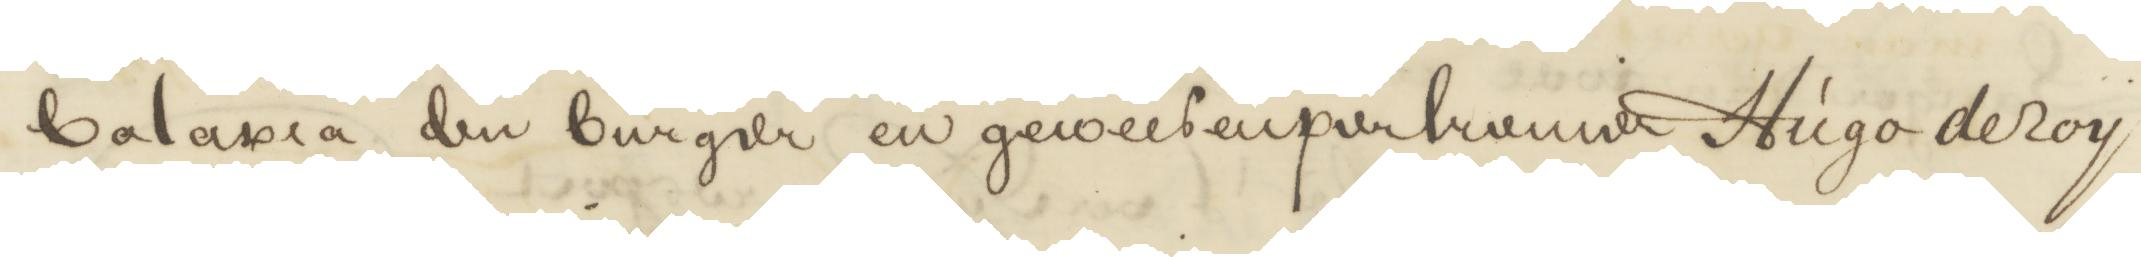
batavia den burger en geweesen perkenier Hugo deroij
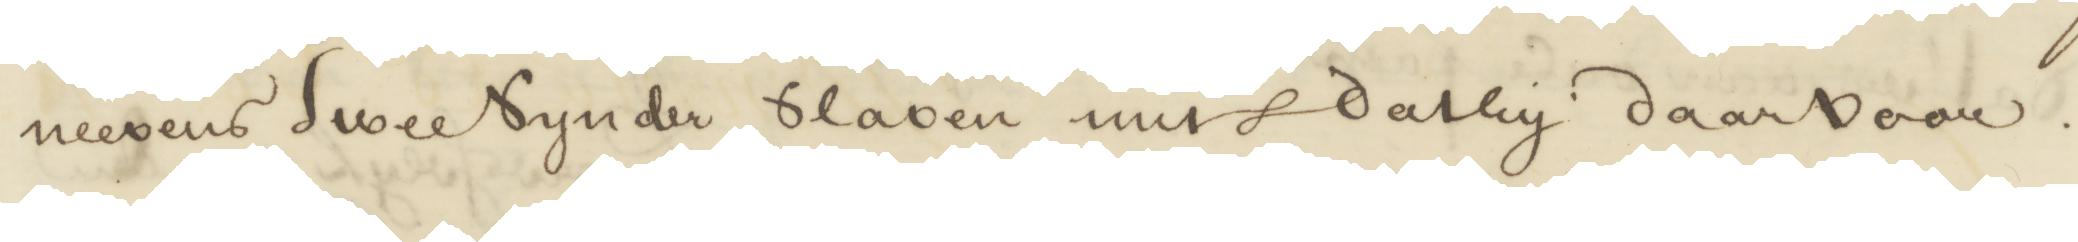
neevens twee sijnder slaven mits dat hij daarvoor
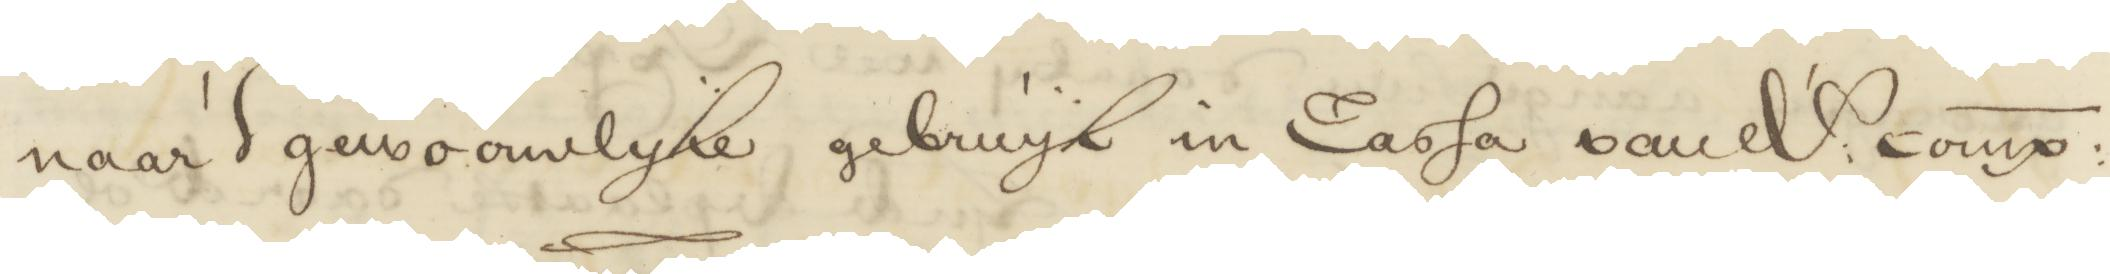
naar 't gewoonelijk gebruijk in Cassa van d'E: comp
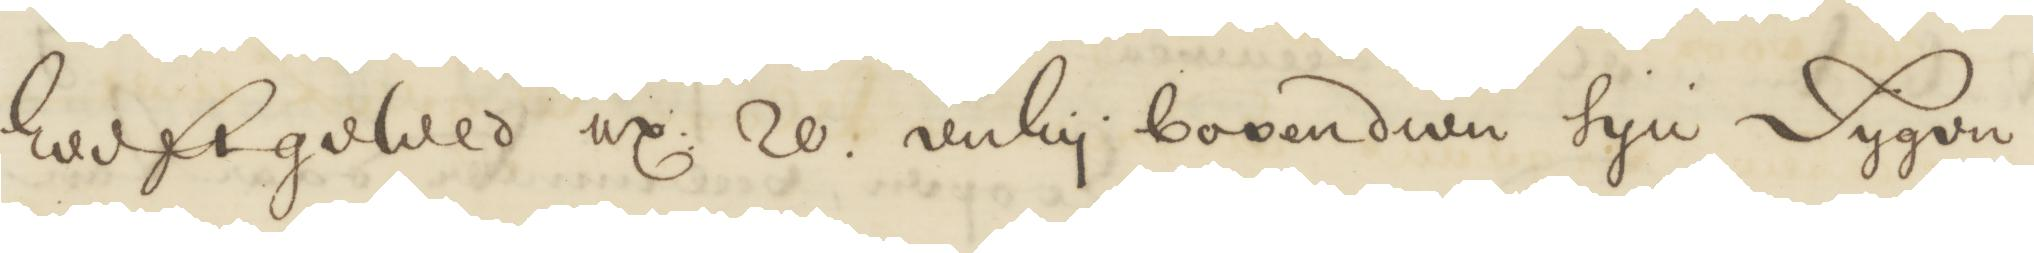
heeft geteld rx: 20. en hij bovendien sijn Eijgen
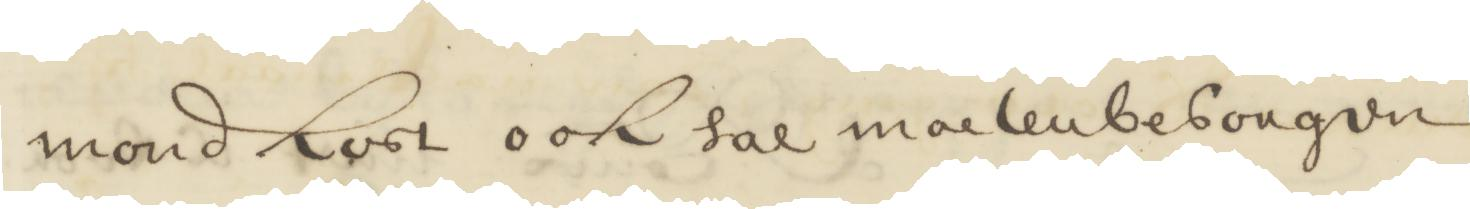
mond kost ook sal moeten besorgen
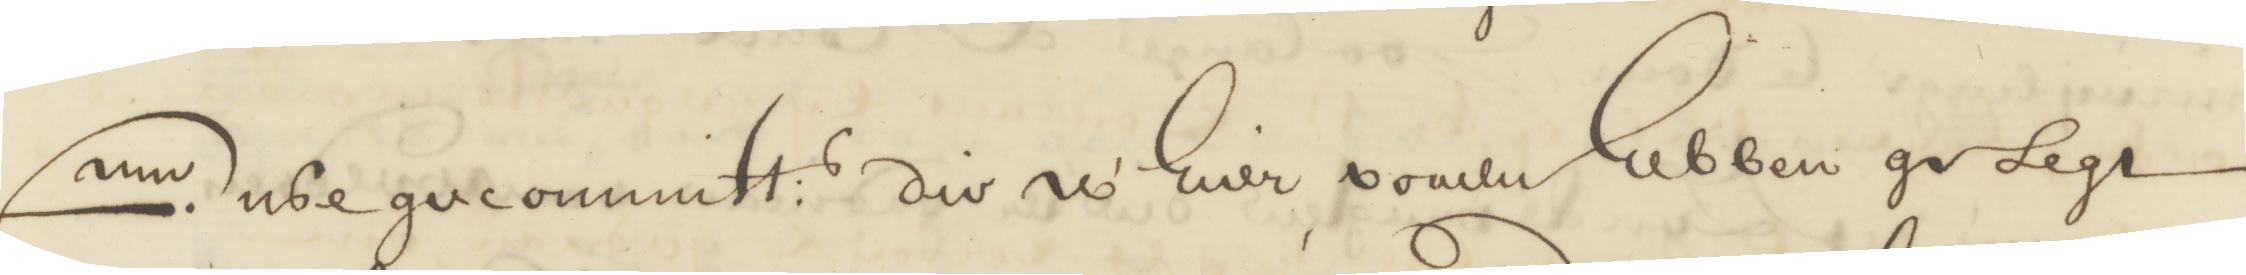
Onse gecommitt:s die w' hier voren hebben gesegt
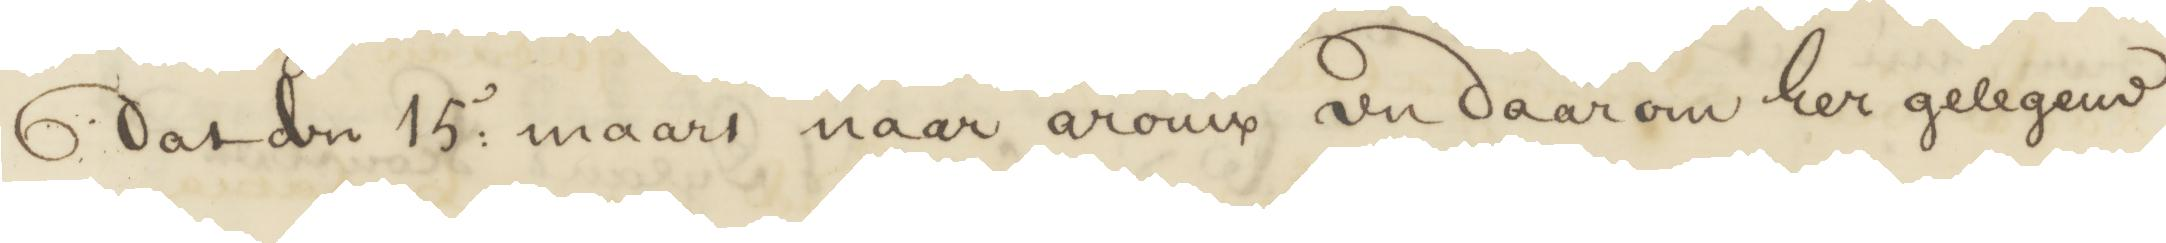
dat den 15:' maart naar arouw en daar om her gelegene
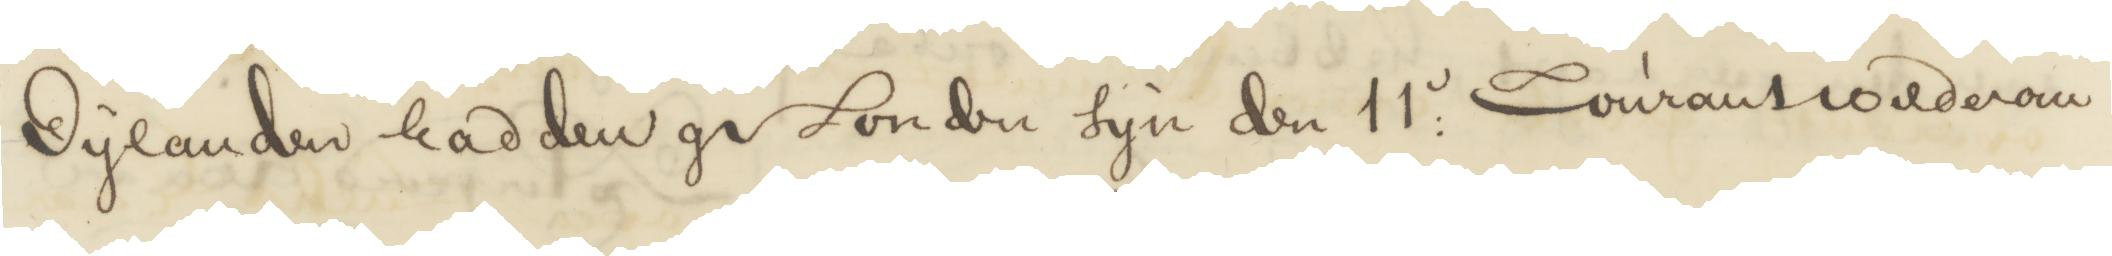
Eijlanden hadden gesonden sijn den 11:' Courant wederom
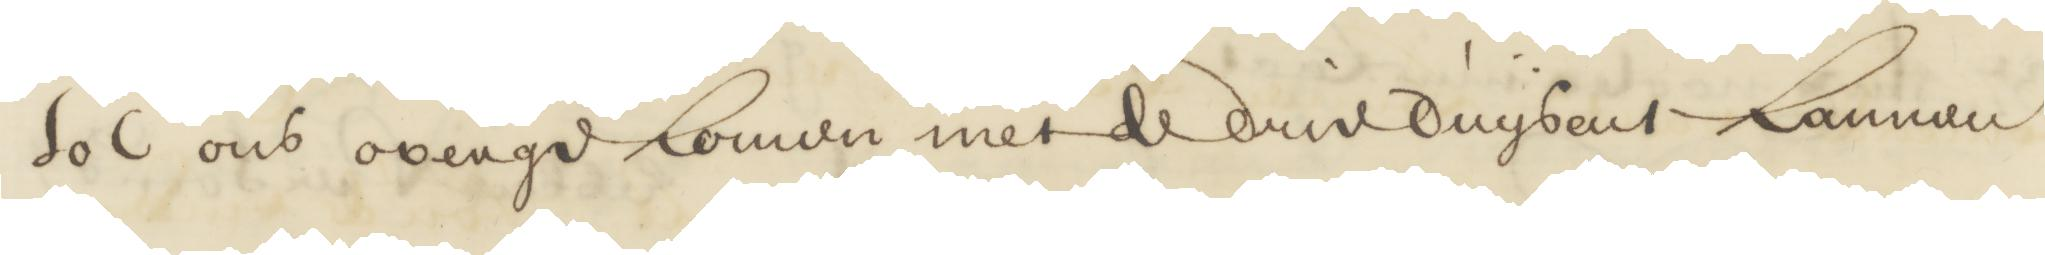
tot ons overgekomen met de drie duijsent kannen
